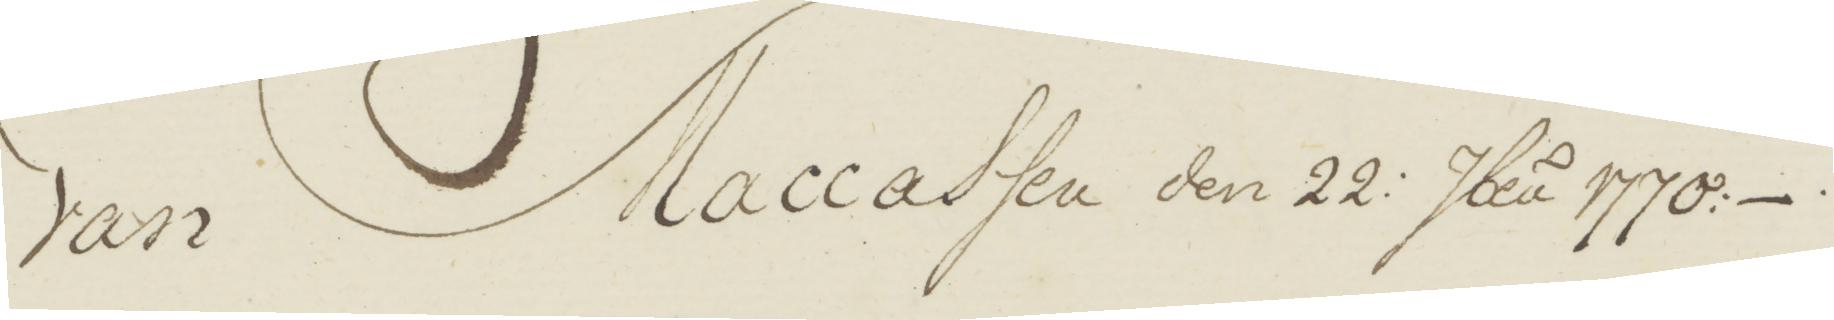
Van Maccassen den 22: 7ber: 1770:—.
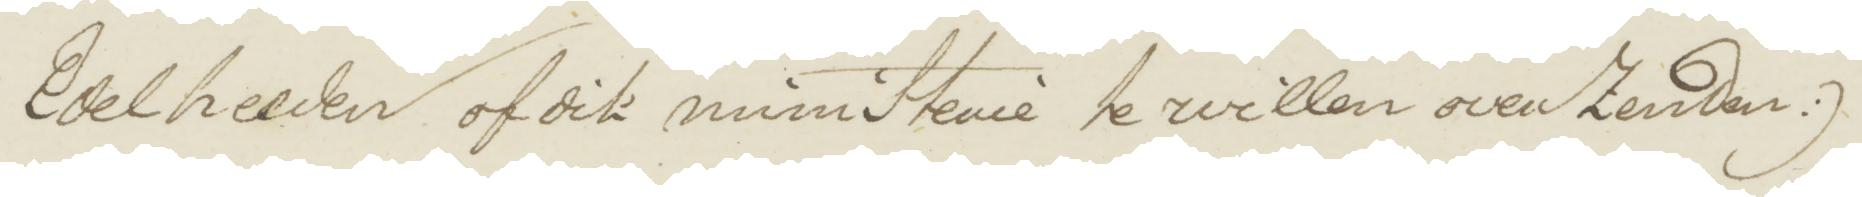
Edelheeden of dit ministerie te willen overzenden :)
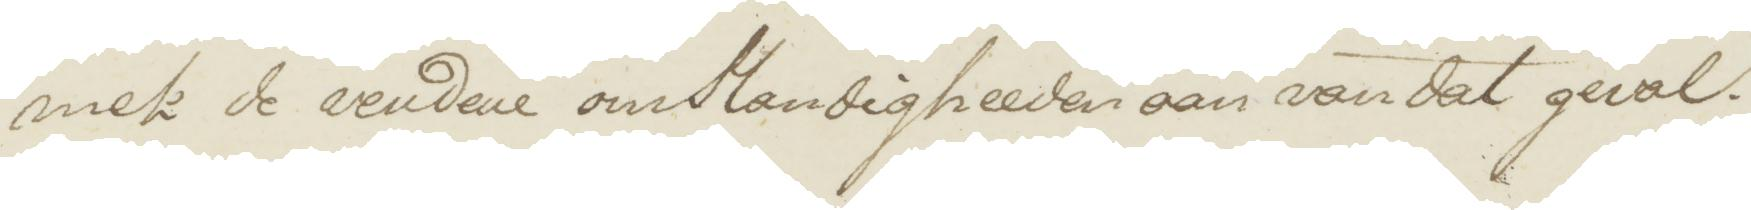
met de verdere omstandigheeden aan van dat geval.
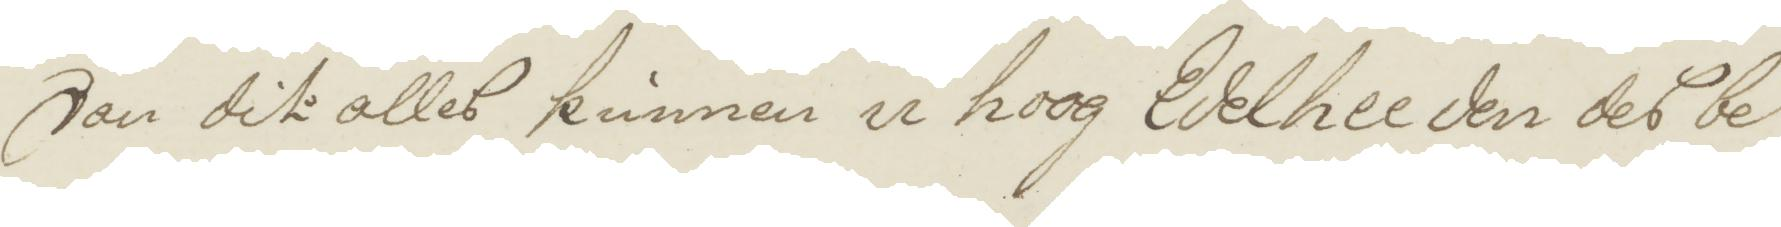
Van dit alles kunnen u hoog Edelheeden des be
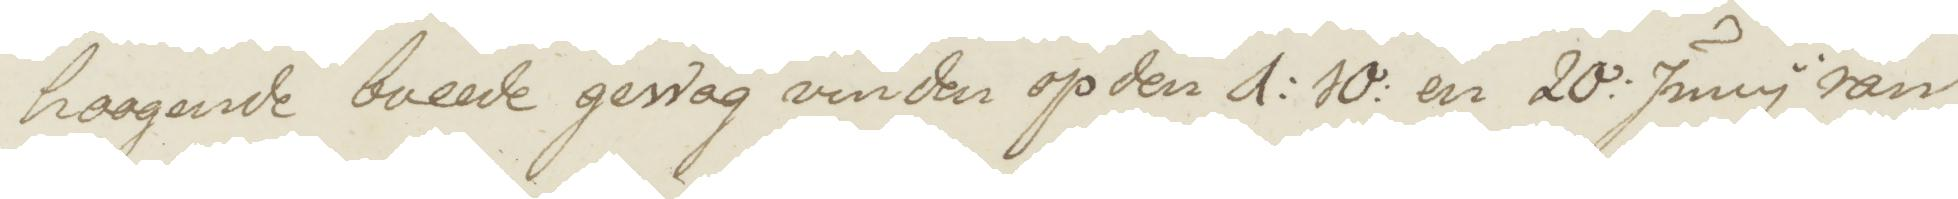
haagende breede gewag vinden op den 4: 10: en 20: Junij van
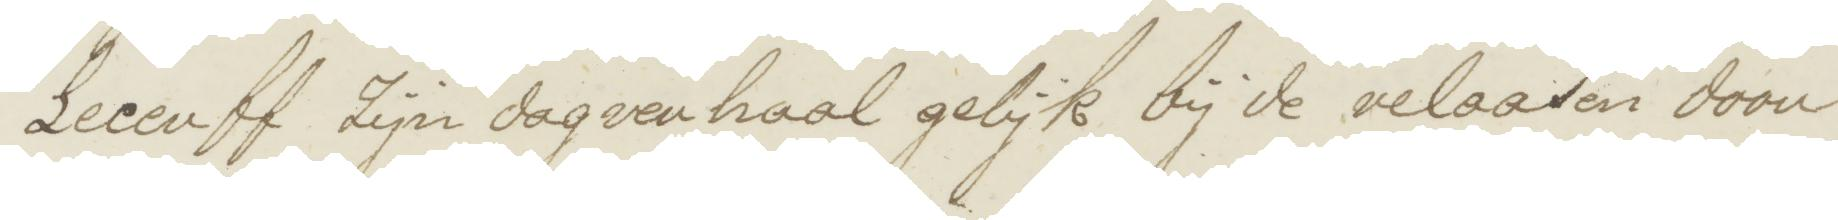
Lecerff zijn dagverhaal gelijk bij de relaasen door
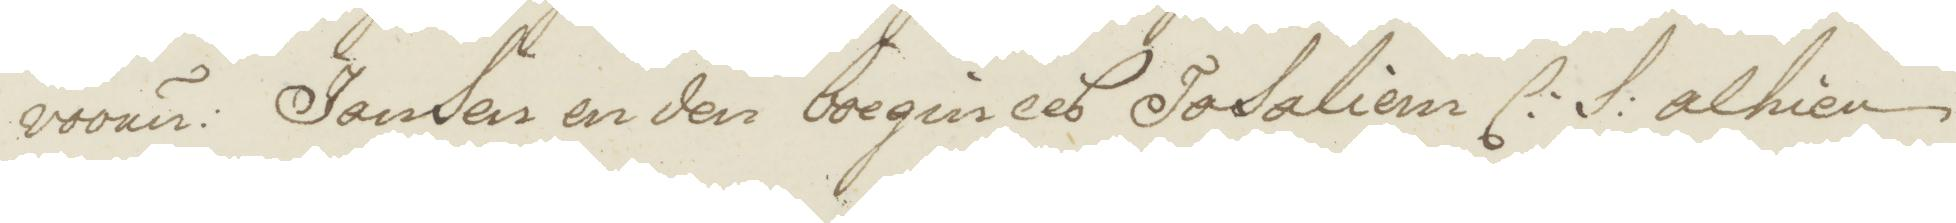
voorn: Iansen en den boeginees Iosaliem C: S: alhier
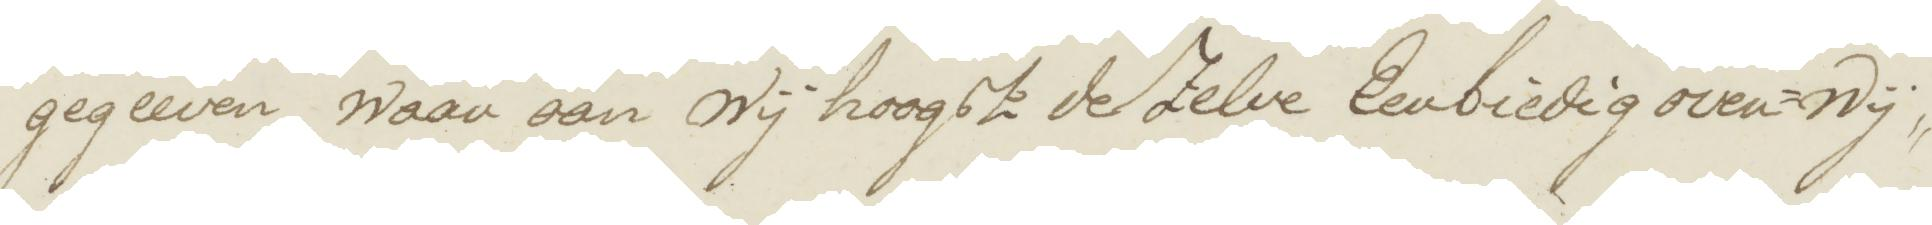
gegeeven, waar aan wij hoogst dezelve Eerbiedig over=wij„
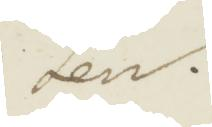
zen.
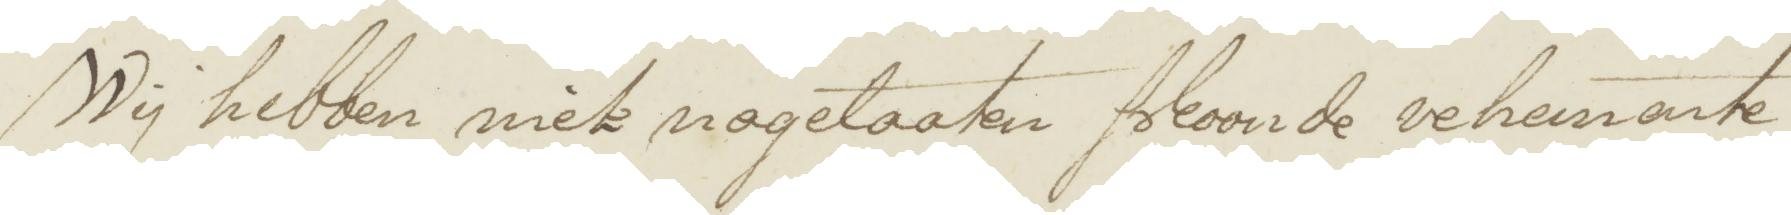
Wij hebben niet nagelaaten schoon de vehemente
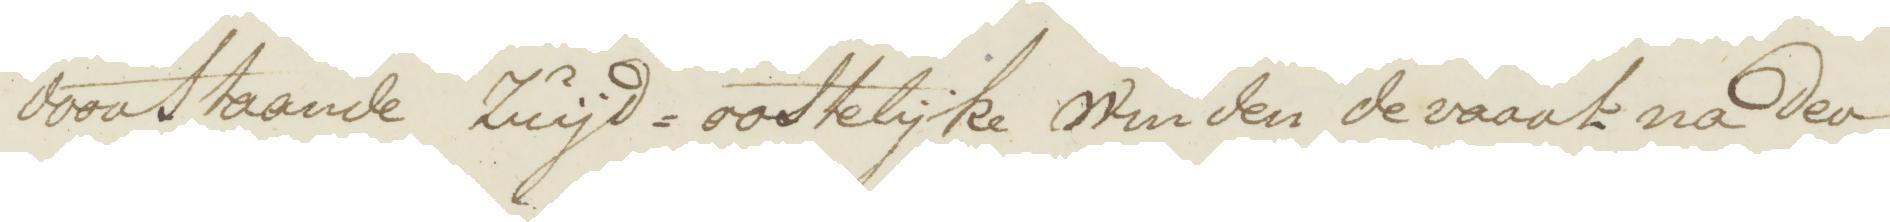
doorstaande zuijd=oostelijke winden de vaart na der
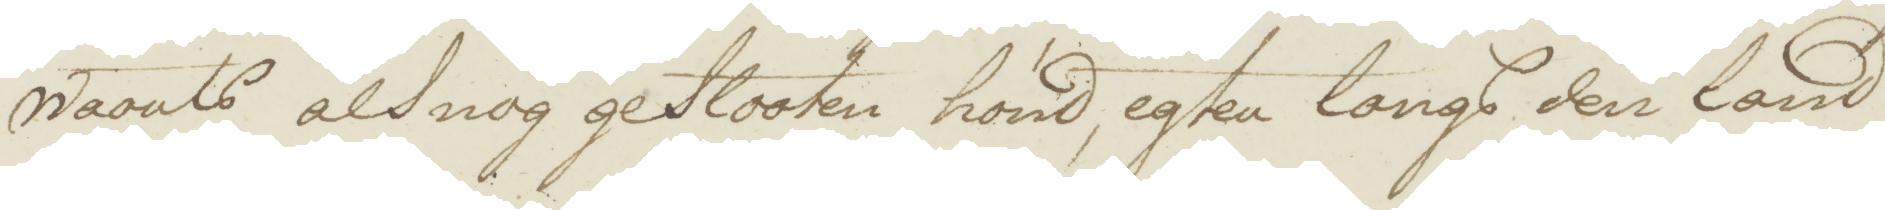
waarts als nog geslooten houd, egter langs den land
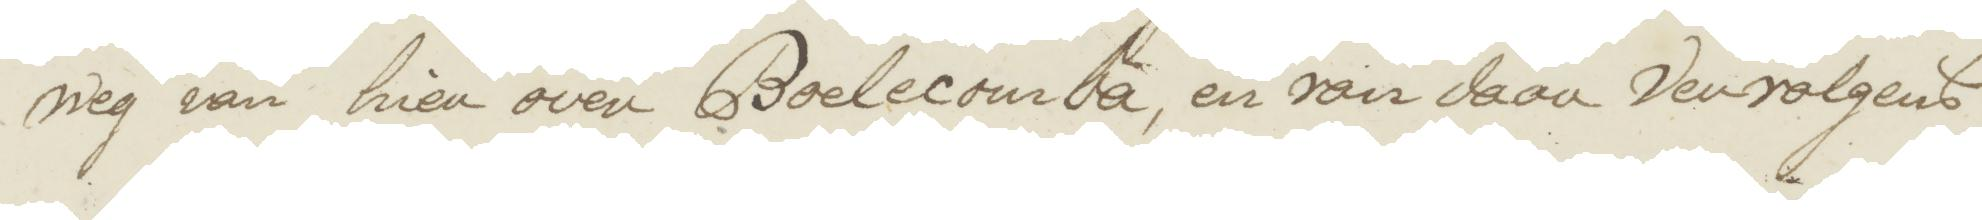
weg van hier over Boelecomba, en van daar vervolgens
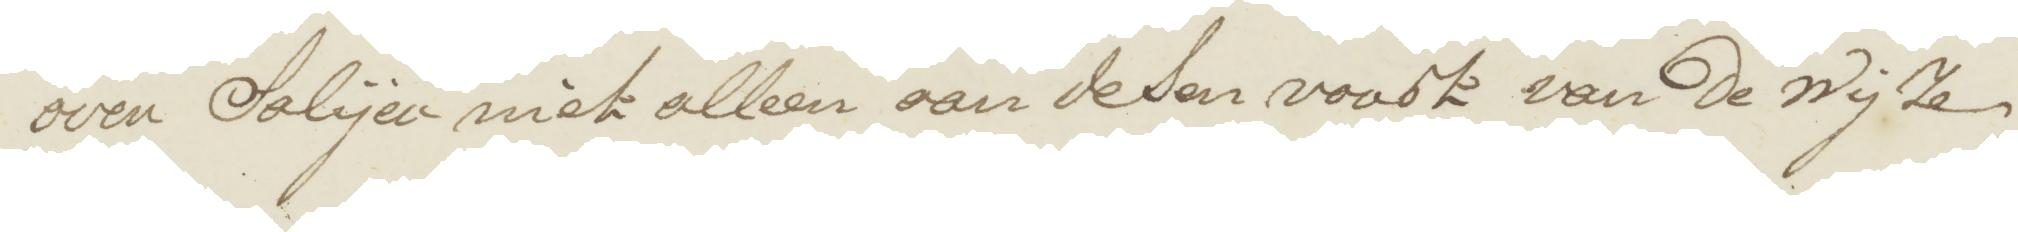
over Salijer niet alleen aan desen vorst van de wijze
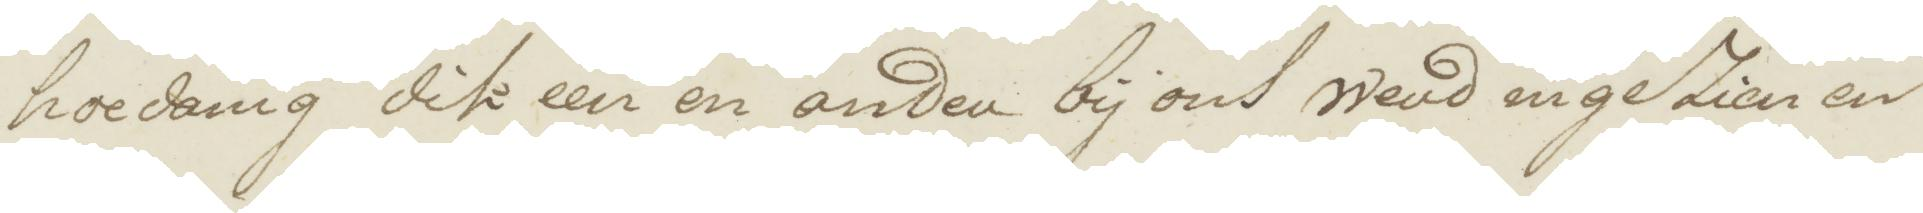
hoedanig dit een en ander bij ons werd ingezien en
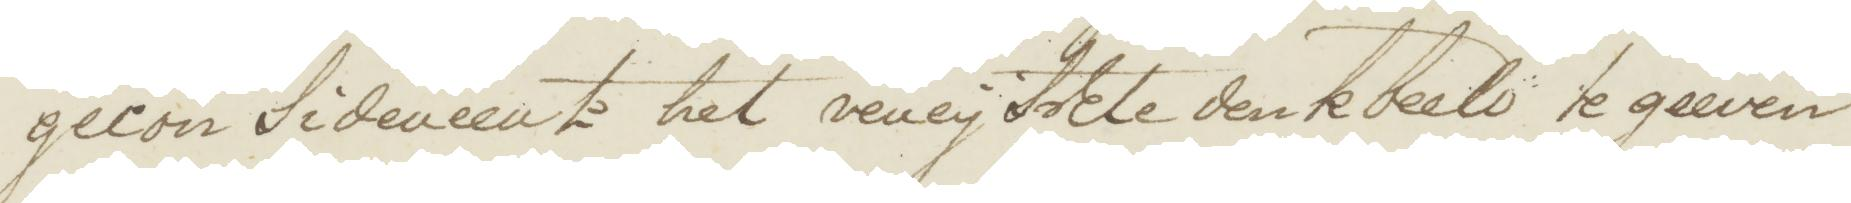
geconsidereert het vereijschte denkbeeld te geeven
